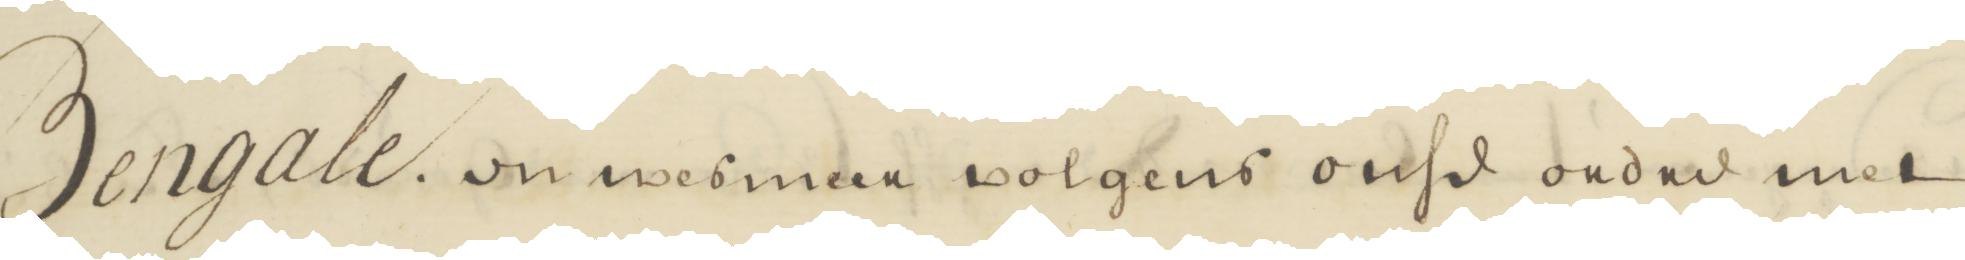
Bengale. en wes meer volgens onse ordre met
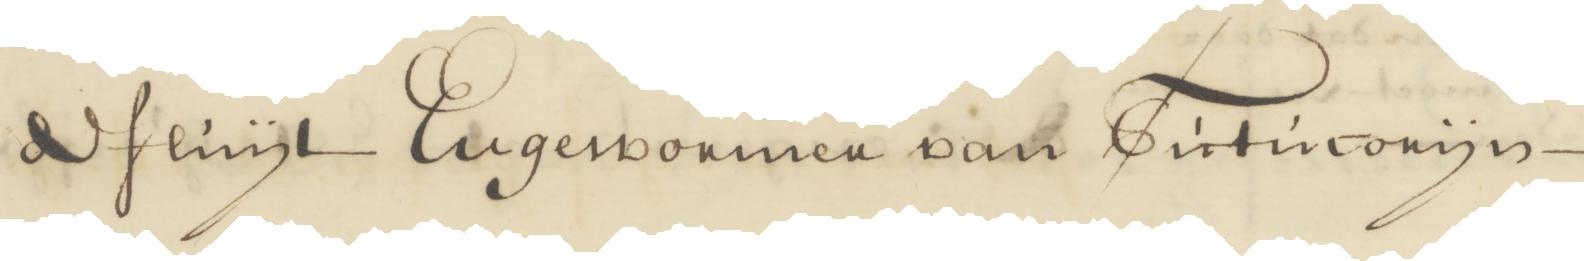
de fluijt Engewormer van Tutucorijn
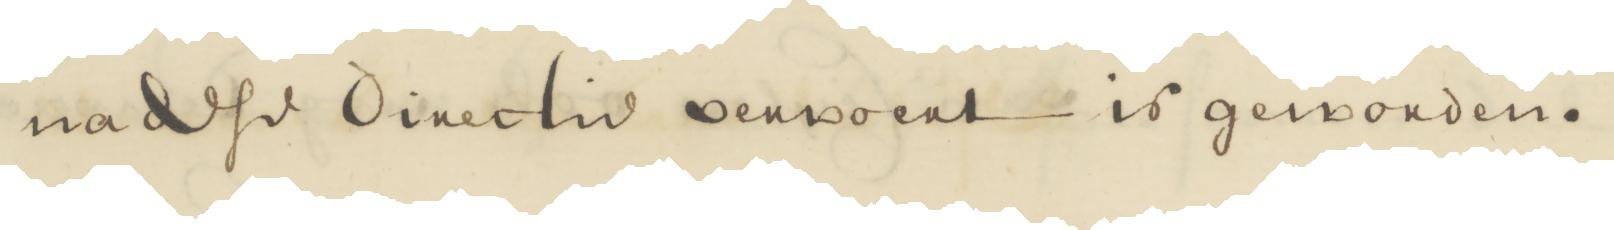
na dese directie vervoert is geworden.
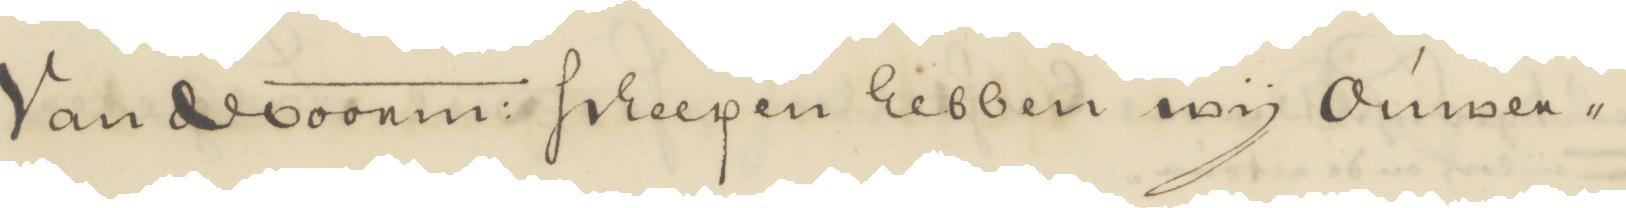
Van de voorm: scheepen hebben wij Ouwer„
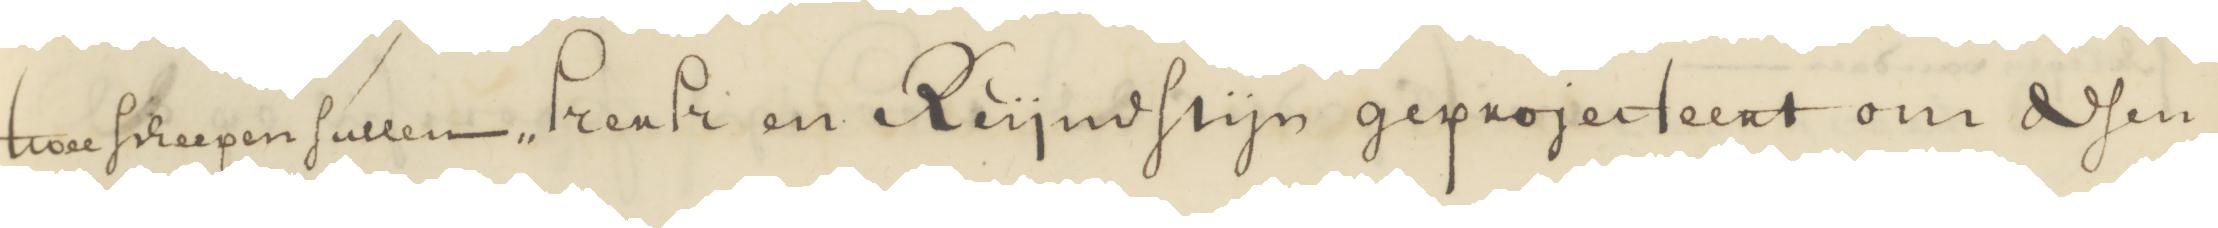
twee scheepen sullen „ kerk en Reijnestijn geprojecteert om desen
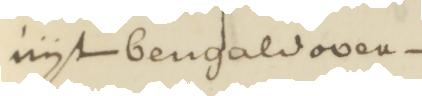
uijt bengale over
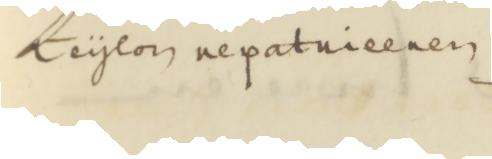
Ceijlon repatrieeren
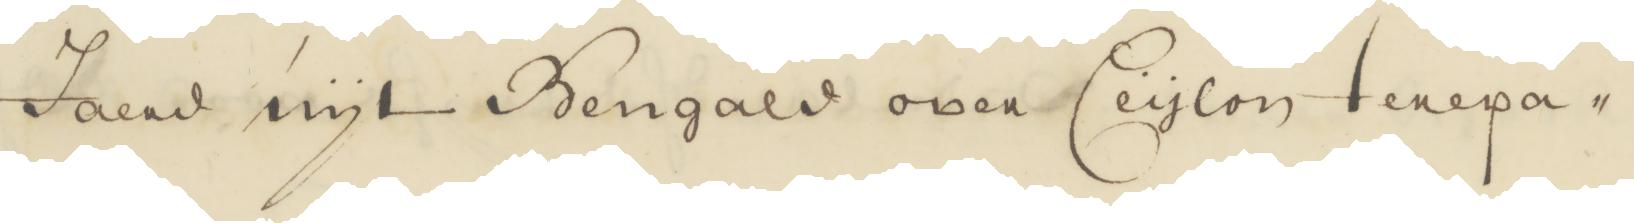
Jaere uijt Bengale over Ceijlon terepa„
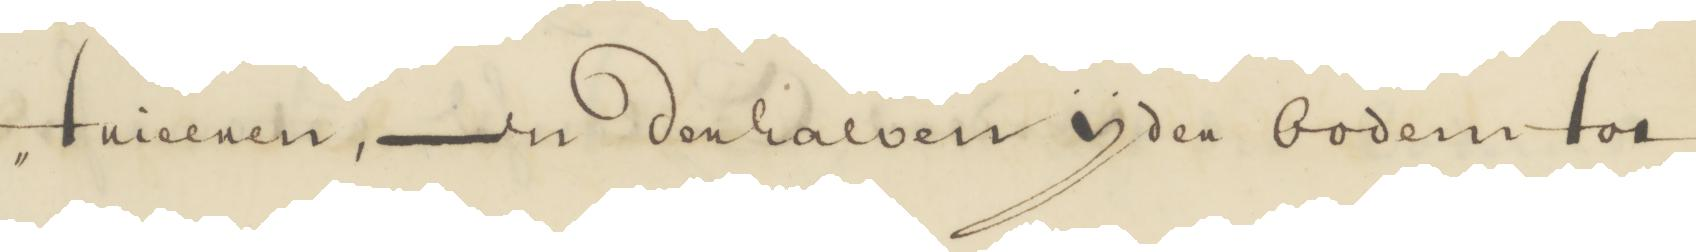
„ trieeren, en derhalven ijder bodem tot
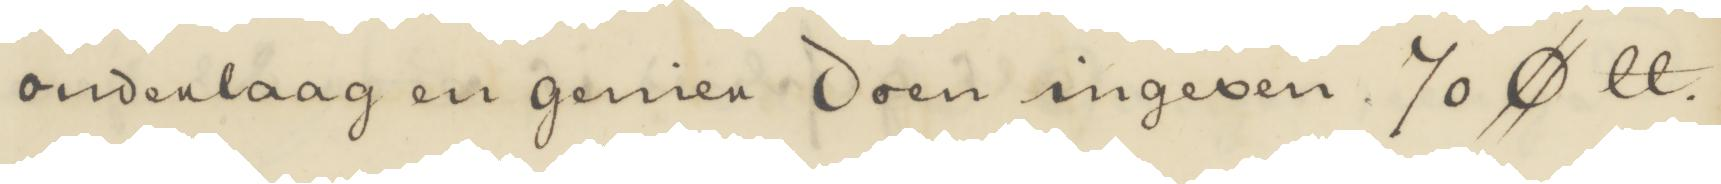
onderlaag en genier doen ingeven. 700 lb.
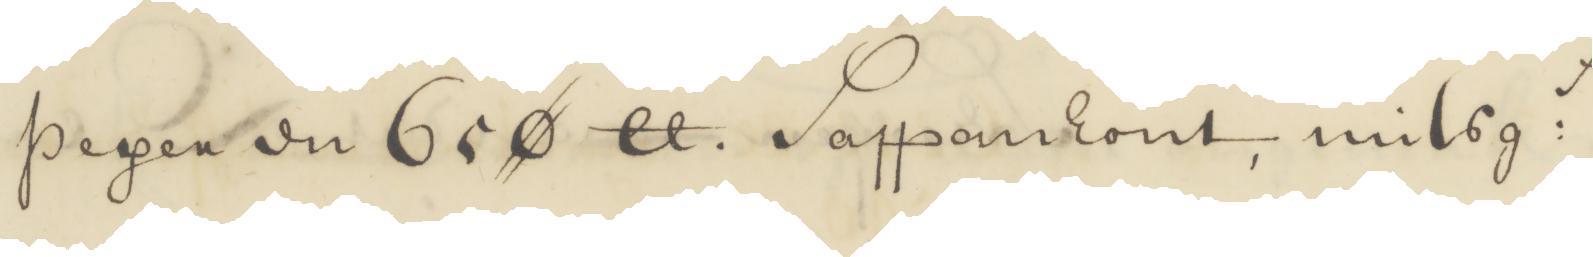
Peper en 650 lb. Sappanhout, mitsg:s
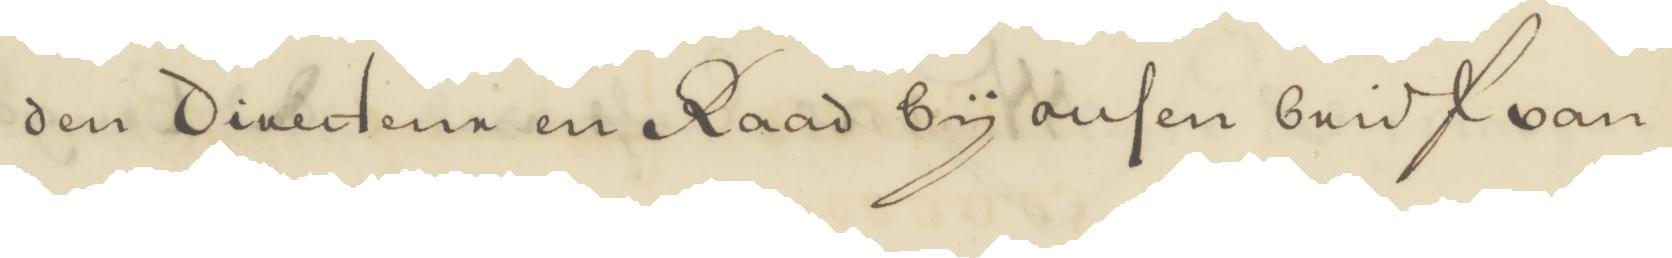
den directeur en Raad bij ousen brief van
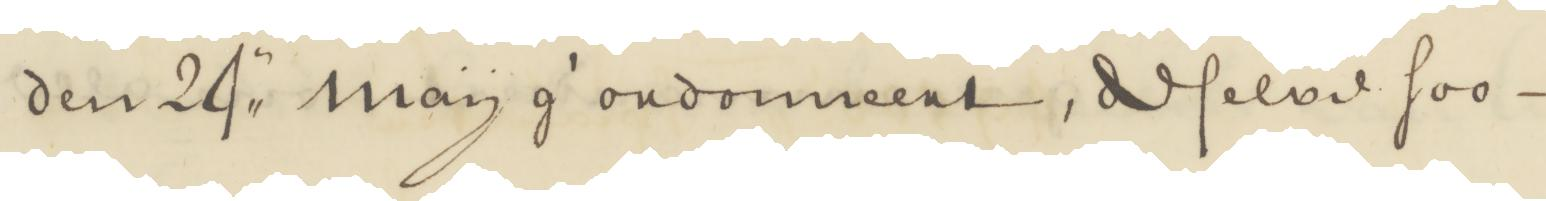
den 24„en maij g’ordonneert, deselve soo
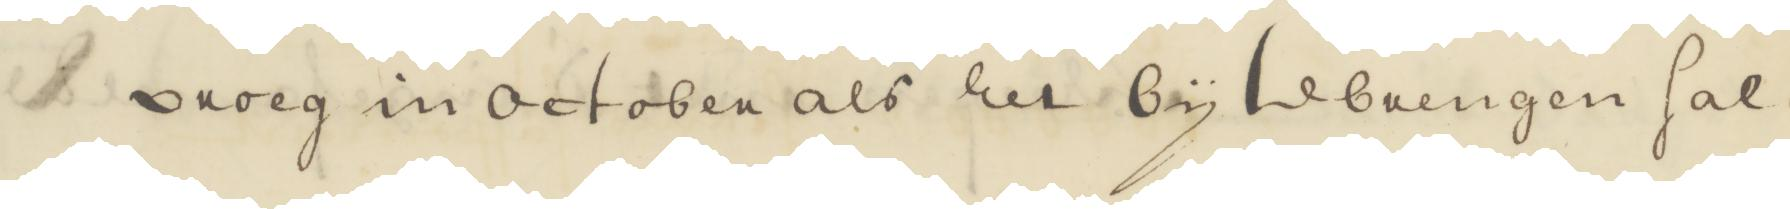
vroeg in October als het bij te brengen sal
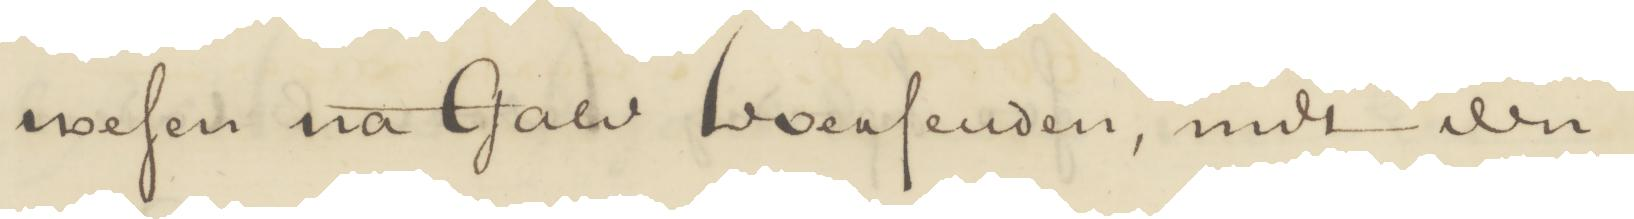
wesen na Gale teversenden, met een
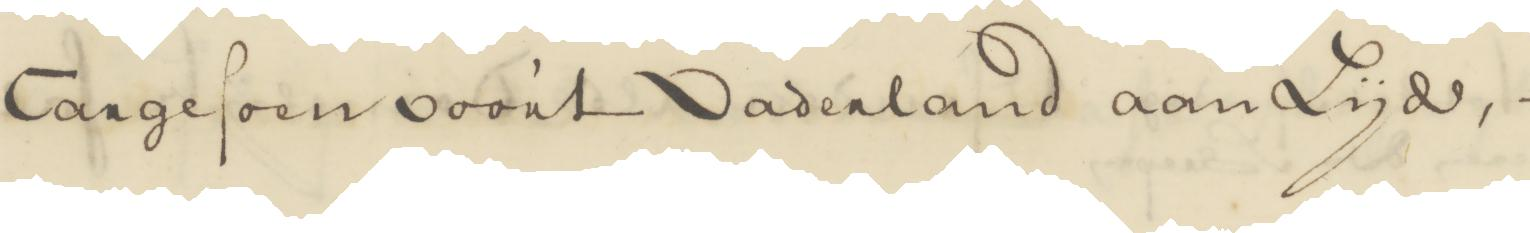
Cargesoen voor’t Vaderland aan zijde,
